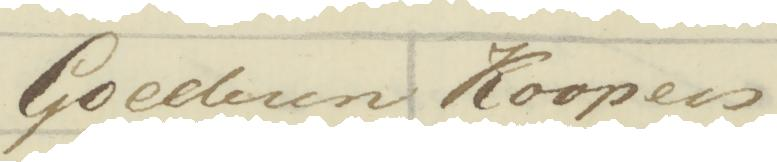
Goederen Koopers
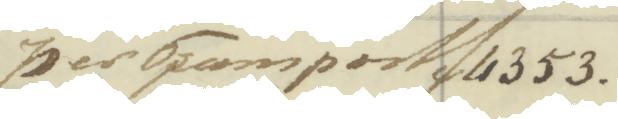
per Transport ƒ 4353.
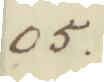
05.
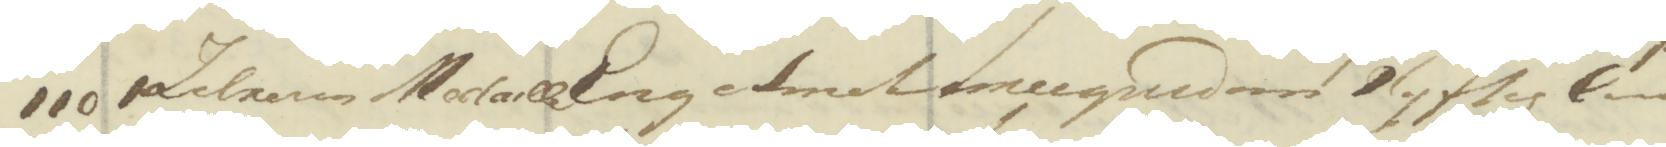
110 1 Zilveren Medaille Engesmit twee guldens Vyftig Cent
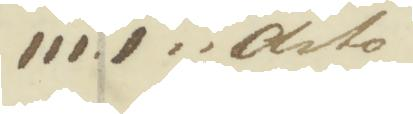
111. 1 „ dito
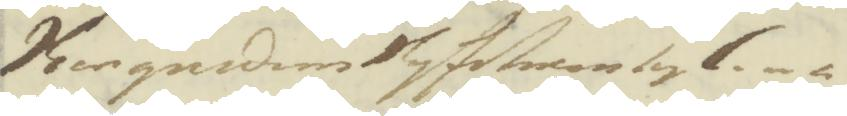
Vier guldens Vyfentwintig Cent
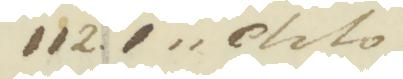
112. 1 „ dito
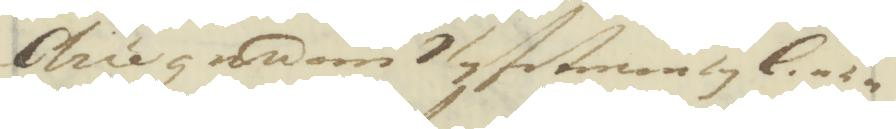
drie guldens Vyfentwintig Cent „
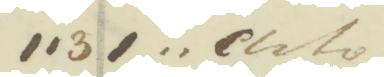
113 1 „ dito
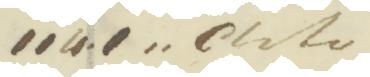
114. 1 „ dito
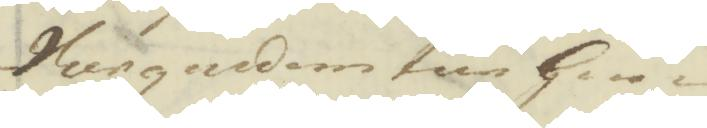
Vier guldens tien Cent
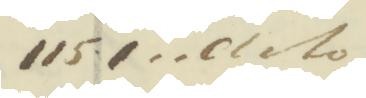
115. 1 „ dito
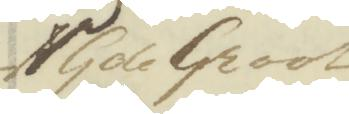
H G de Groot
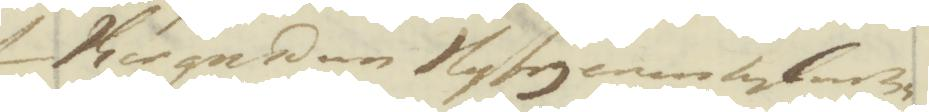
Vier guldens Vyfenzeventig Cent „
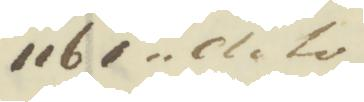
116 1 „ dito
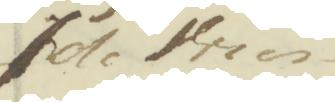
J de Vries
